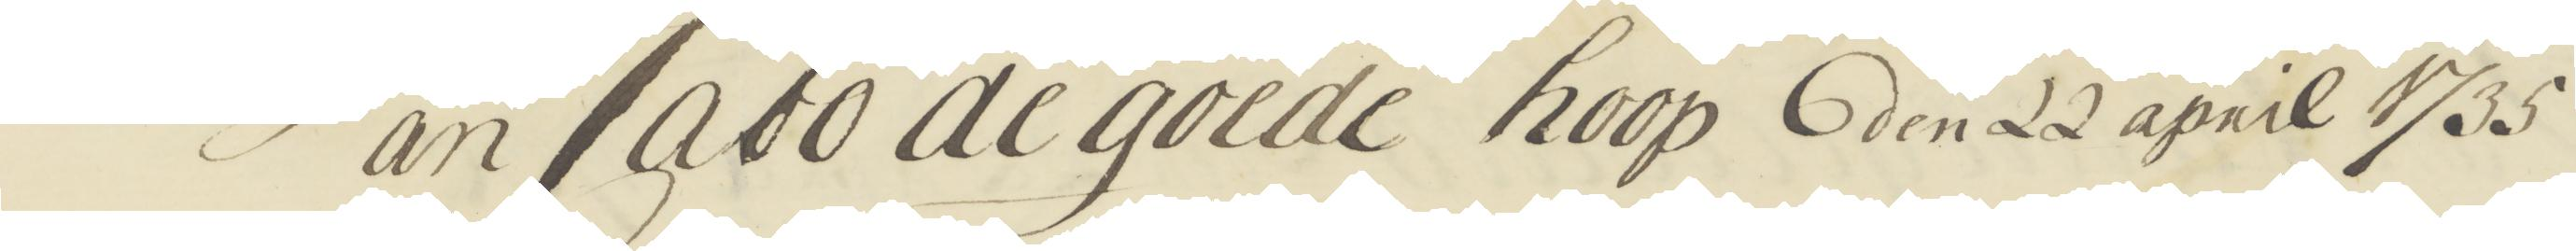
Van Cabo de goede hoop den 22 april 1735
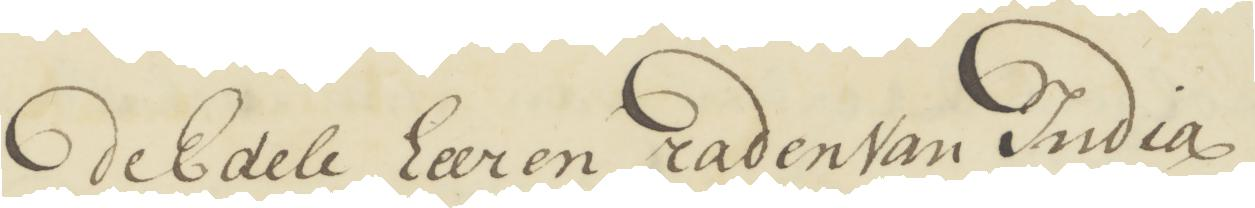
de Edele heeren raden van India
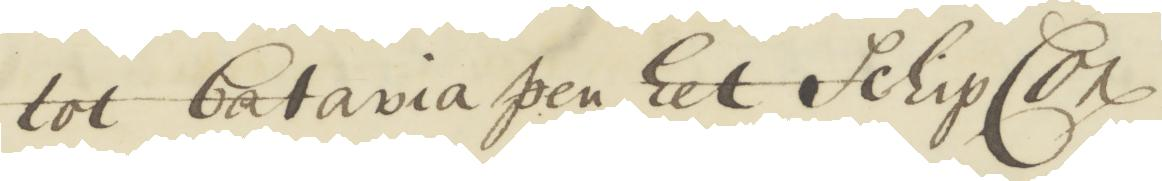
tot batavia per het schip Cor
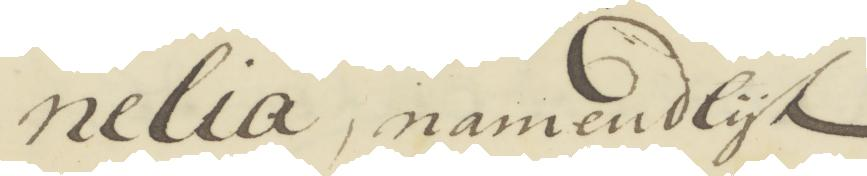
nelia, namendlijk
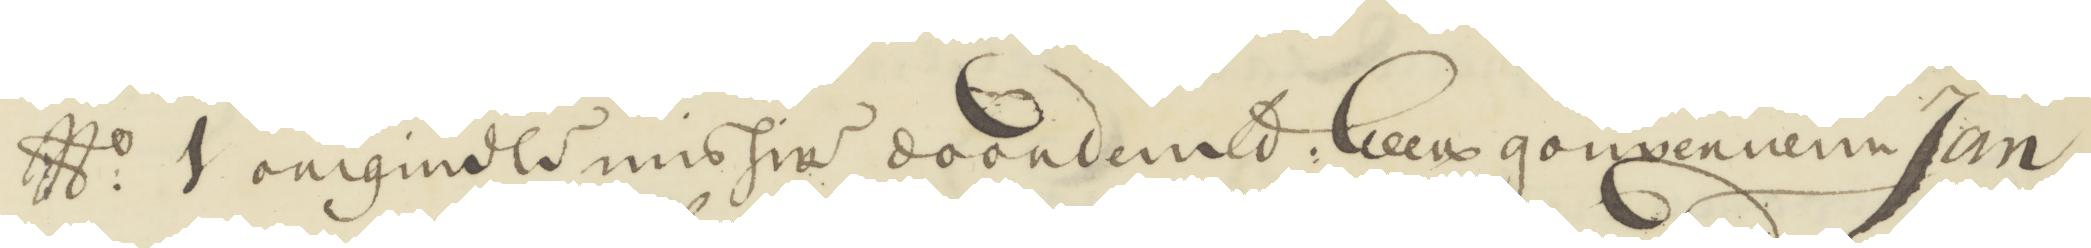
N:o 1 originele missive door den Ed: heer gouverneur Jan
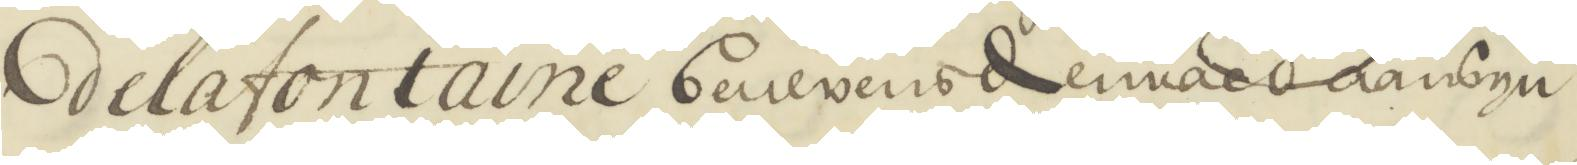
de la fontaine benevens den raed aan syn
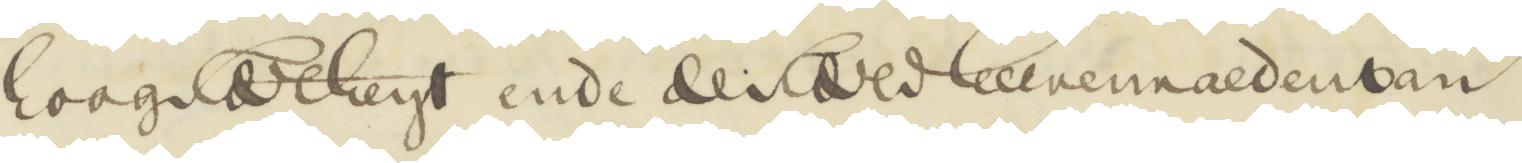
hoog Edelheyt ende de Edele heeren raeden van
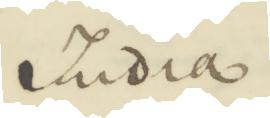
India
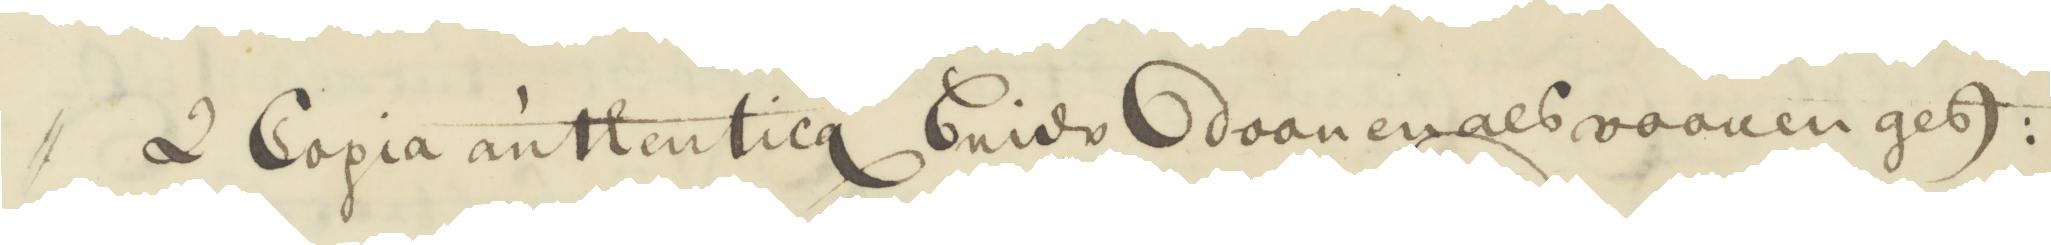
„ 2 Copia authenticq briev door en als vooren gesz:
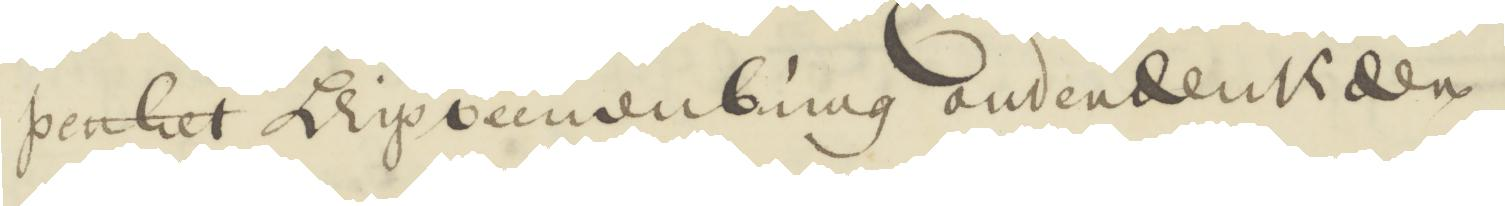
per het schip veenenburg onder den 15 der
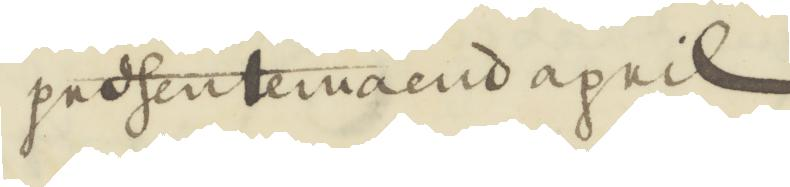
presente maend april
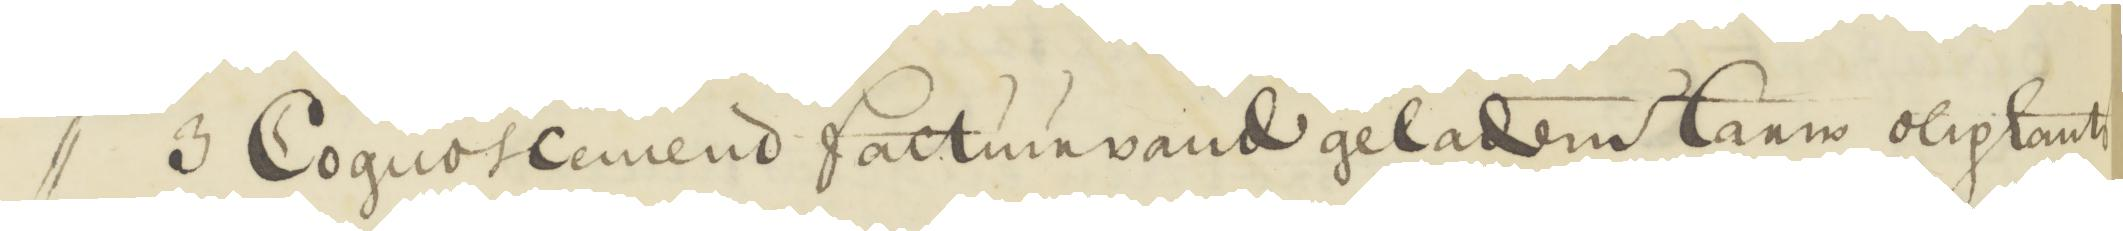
„ 3 Cognoscemend factuur van de geladene tarw oliphants
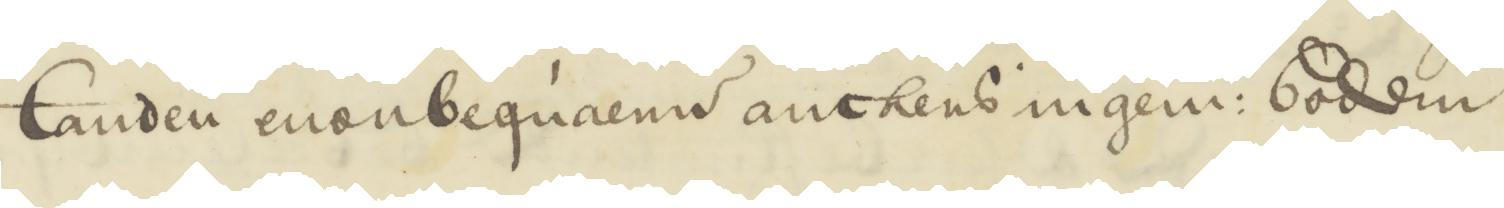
tanden en onbequaeme anckers in gem: bodem
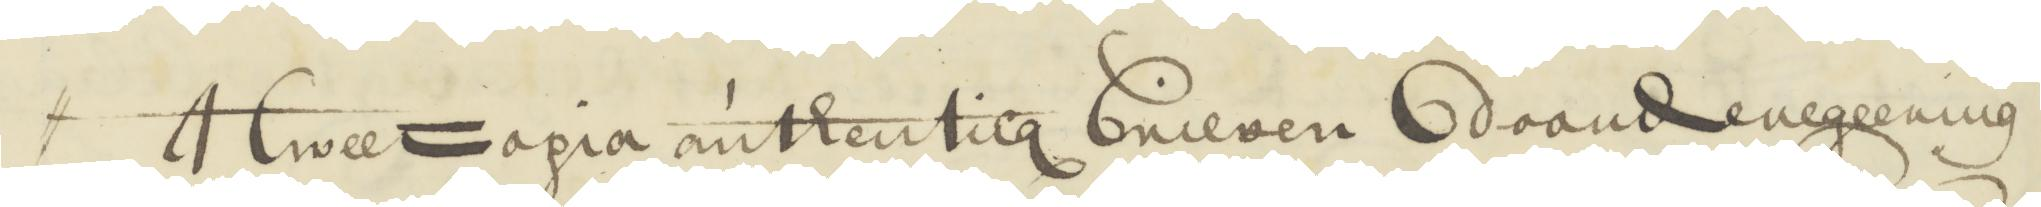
„ 4 twee copia authenticq brieven door de regeering
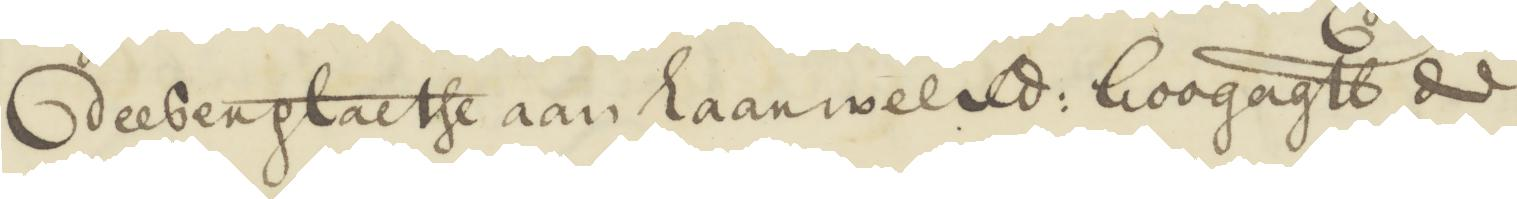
deeser plaetse aan haar wel Ed: hoogagtb de
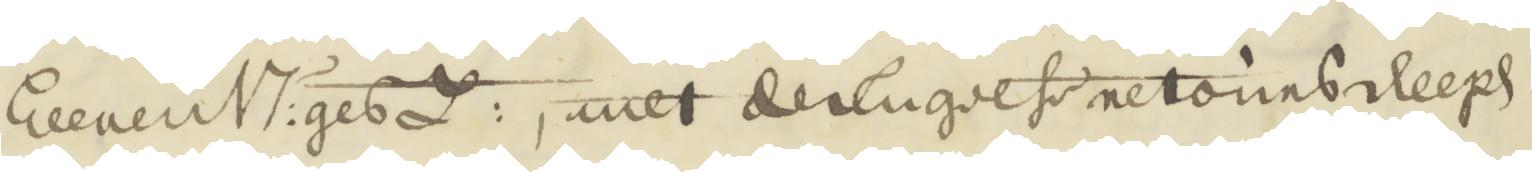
heeren 17:' gesz:, met de Engelse retourscheepen
